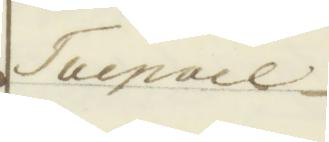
Toepoel
